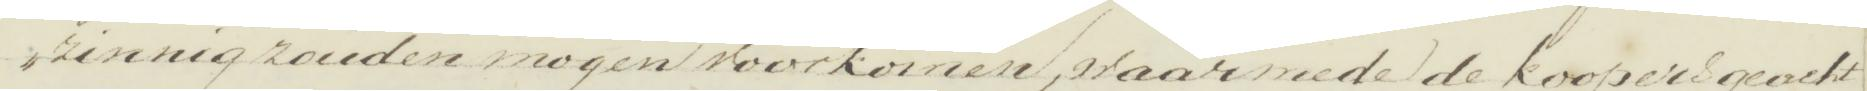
„zinnig zouden mogen voorkomen, waarmede de koopers geacht
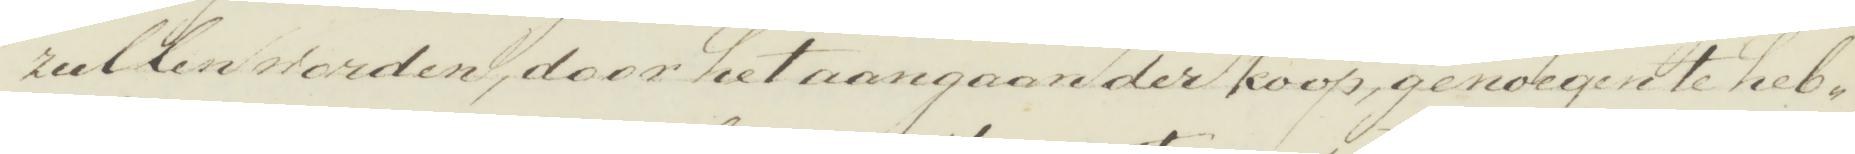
zullen worden, door het aangaan der koop, genoegen te heb„
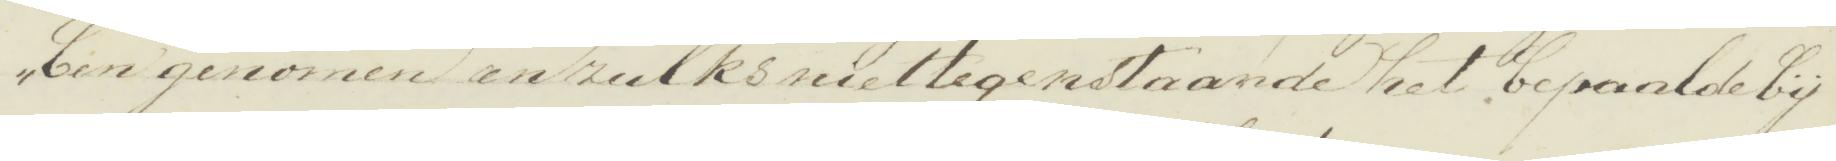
„ben genomen en zulks niettegenstaande het bepaalde bij
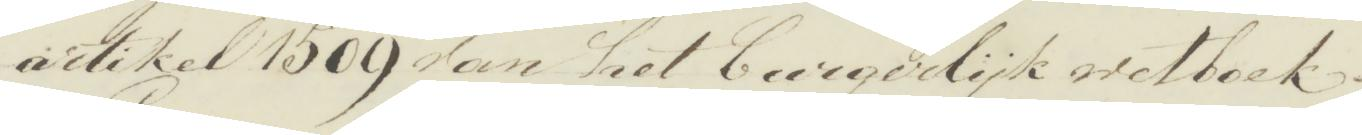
artikel 1509 van het burgerlijk wetboek
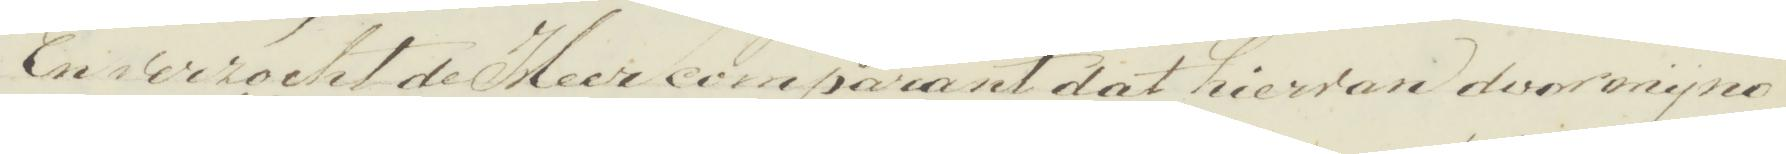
En verzocht de Heer comparant dat hiervan door mij no
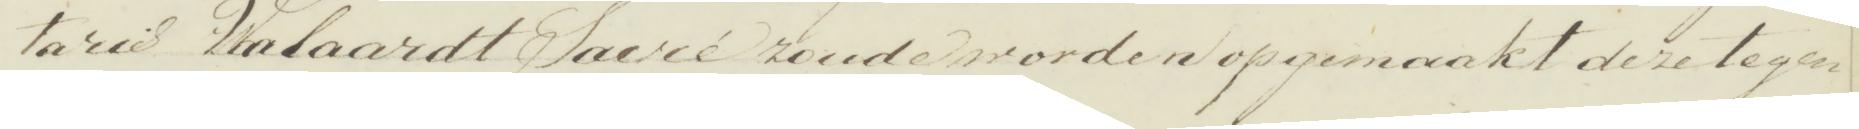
taris Walaardt Sacré zoude worden opgemaakt deze tegen
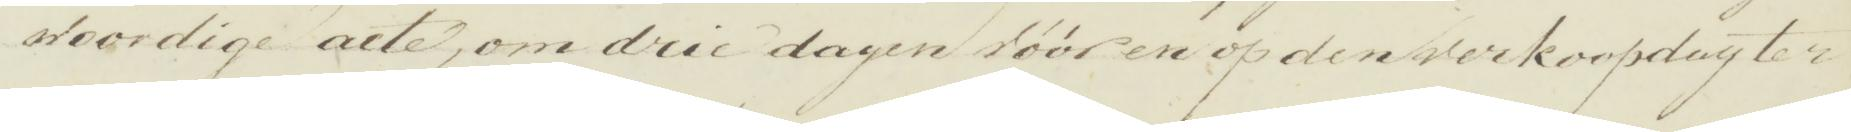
woordige acte, om drie dagen vóór en op den verkoopdag ter
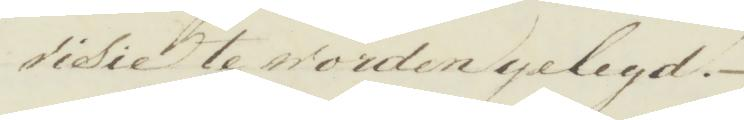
visie te worden gelegd.-
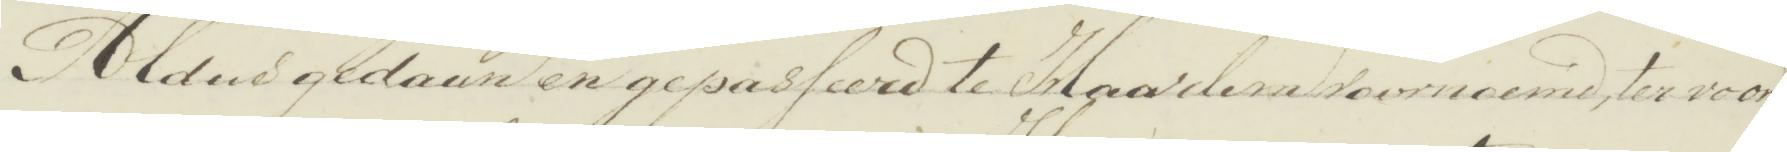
Aldus gedaan en gepasseerd te Haarlem voornoemd, ter voor
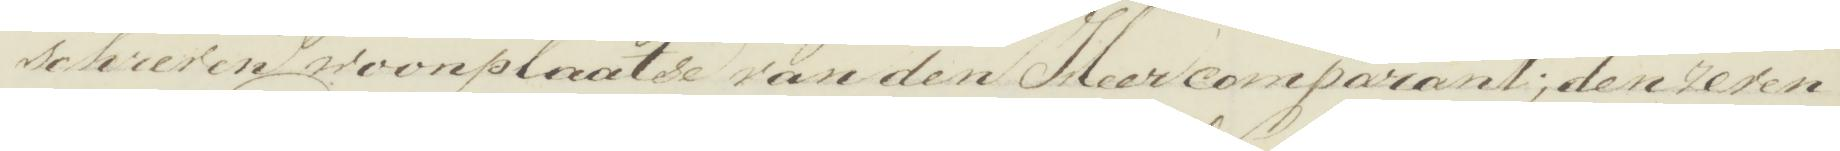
schreven woonplaatse van den Heer comparant; den zeven
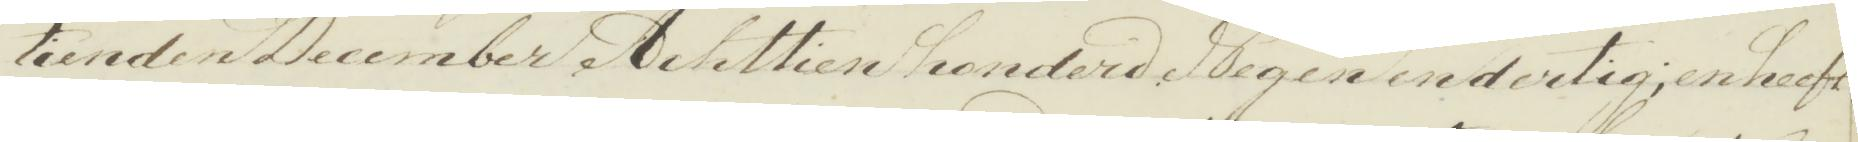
tienden December Achttien honderd Negen endertig, en heeft
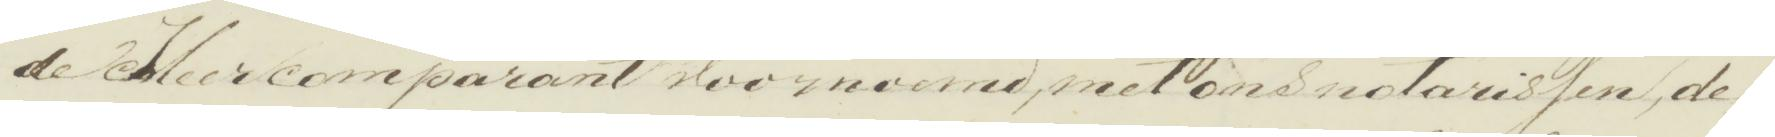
de Heer comparant voornoemd, met ons notarissen, de
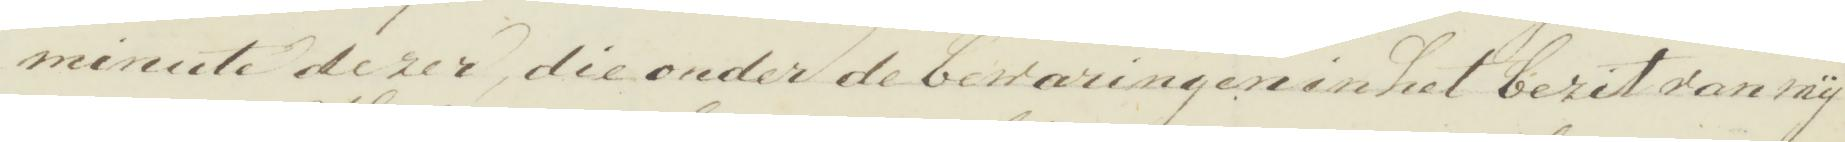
minute dezer, die onder de bewaring en in het bezit van mij
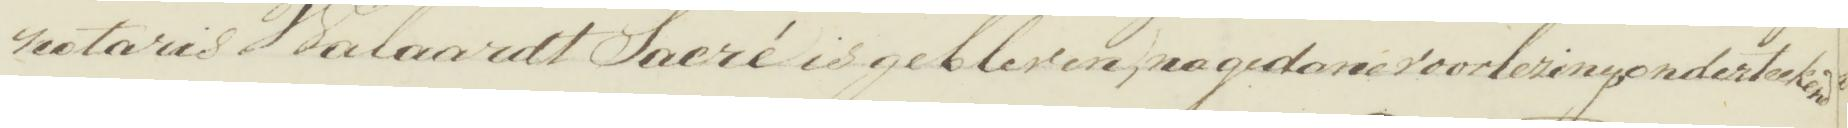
notaris Walaardt Sacré is gebleven, na gedane voorlezing, onderteekend
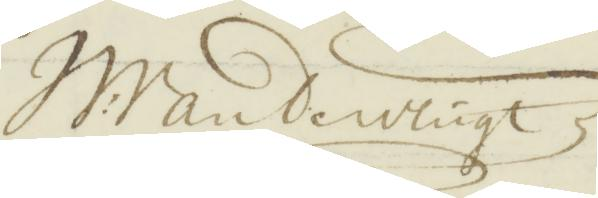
W:Vandervlugt
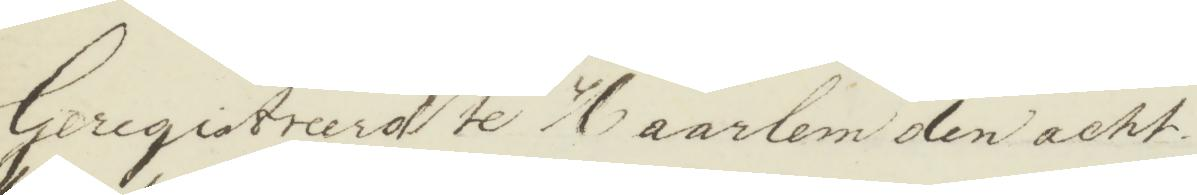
Geregistreerd te Haarlem den acht.
